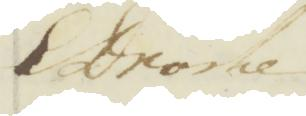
E Droste
